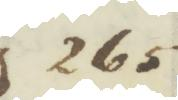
265
